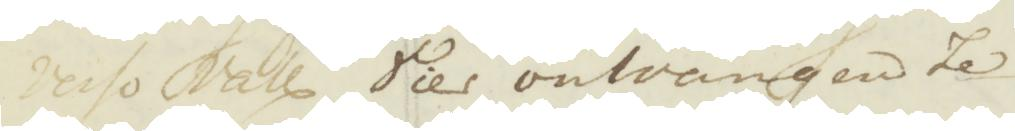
verso Vak Vier ontvangen Ze
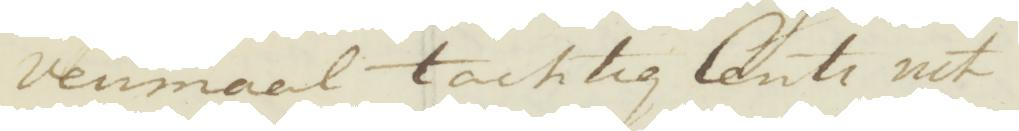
venmaal tachtig Cents uit
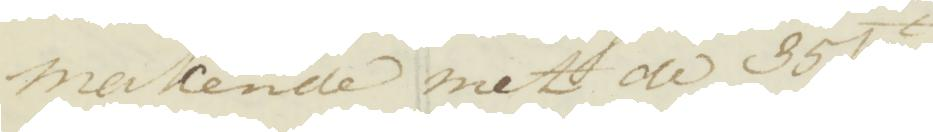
makende met de 35 /c=t
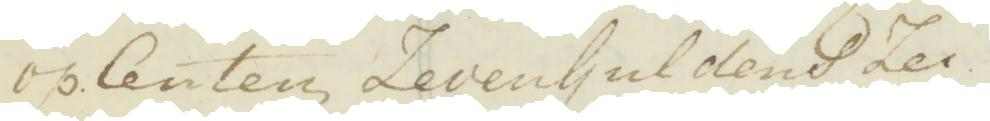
op Centen Zeven Guldens Zes
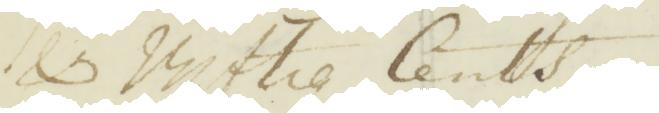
& Vijftig Cents. —
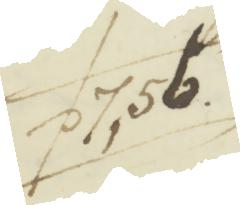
ƒ7,56.
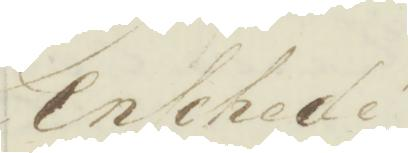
Enschede
